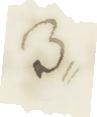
3„
